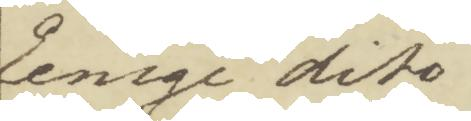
Eenige dito
